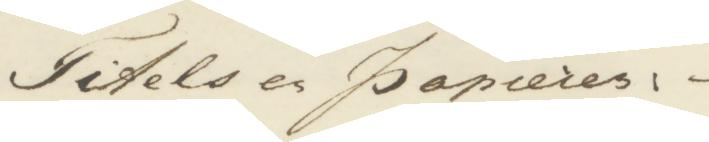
Titels en Papieren:.
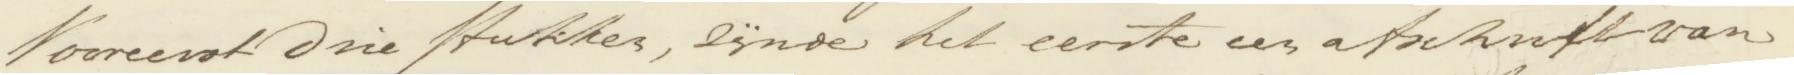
Vooreerst drie stukken, zijnde het eerste een afschrift van
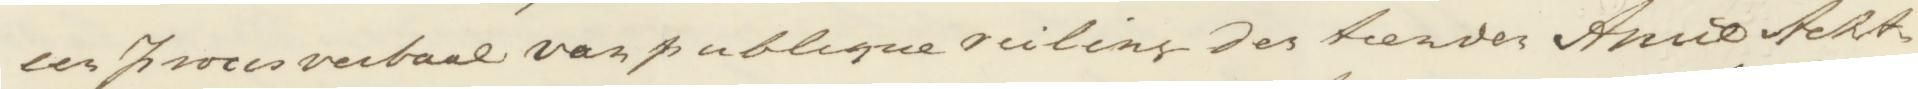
een proces verbaal van publique veiling den tienden April Acht„
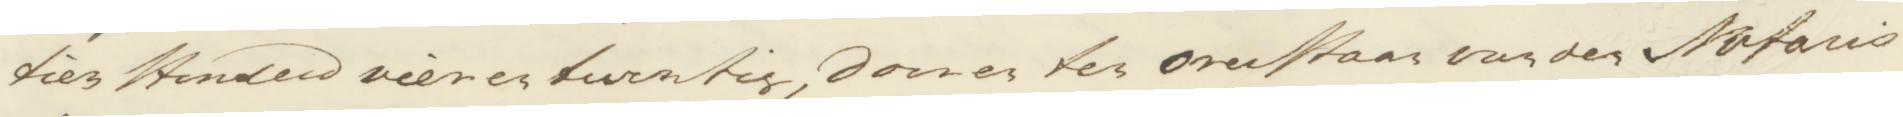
tien Honderd vier en twintig, door en ten overstaan van den Notaris
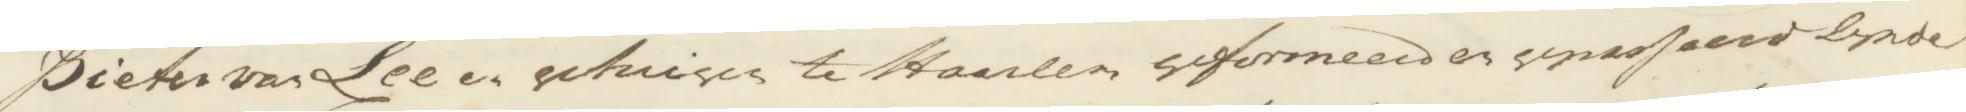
Pieter van Lee in getuigen te Haarlem geformeerd en gepasseerd zynde
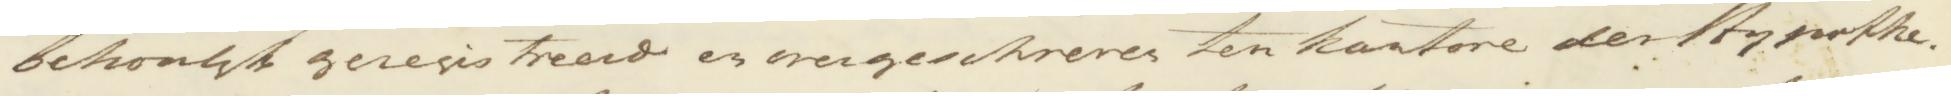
behoorlyk geregistreerd en overgeschreven ten kantore der Hypothe.
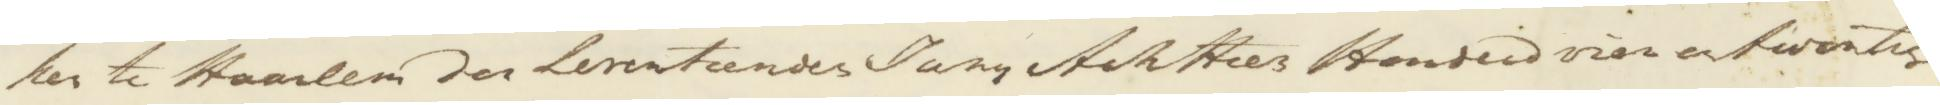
ken te Haarlem den Zeventienden Iuny Achttien Honderd vier en twintig
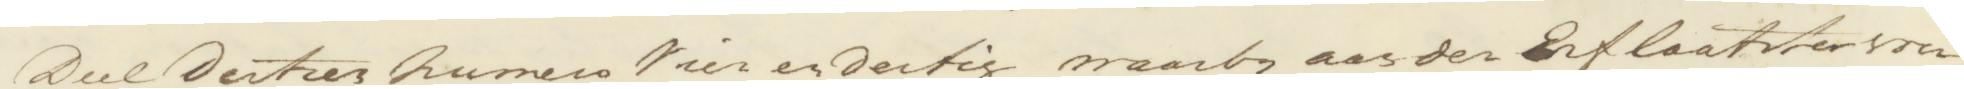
Deel dertien numero vier en dertig, waarby aan den Erflaatster voor
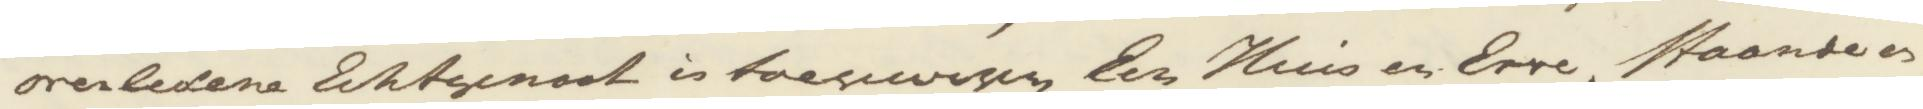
overledene Echtgenoot is toegewezen Een Huis en Erve, staande en
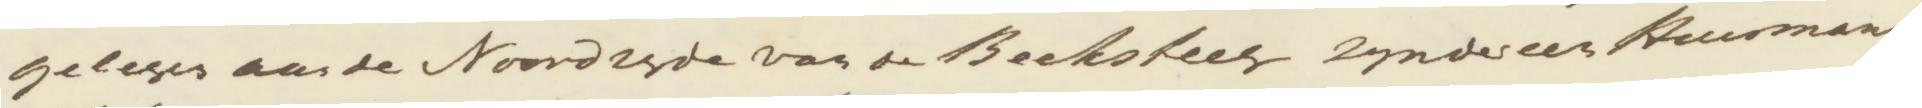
gelegen aan de Noordzyde van de Beeksteeg zynde een Huismans
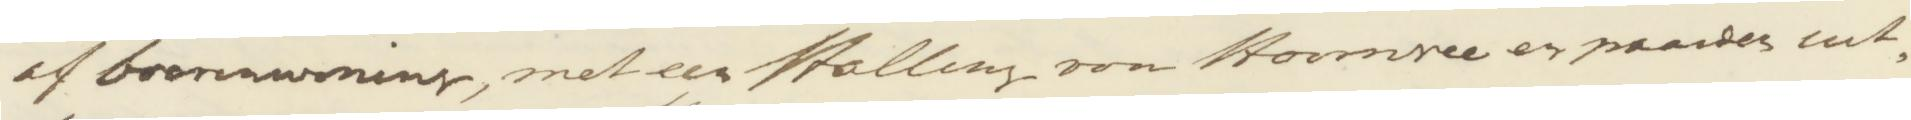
of boerenwoning, met een stalling van Hoornvee en paarden uit
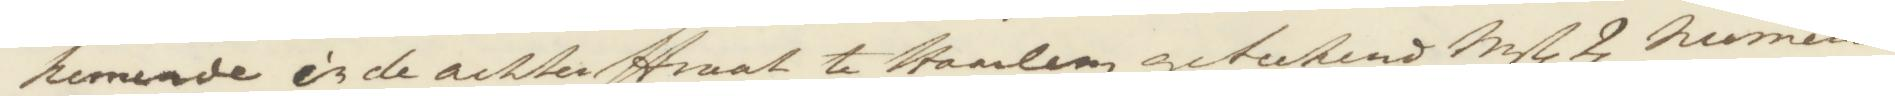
komende in de achterstraat te Haarlem geteekend wyk 2, numero
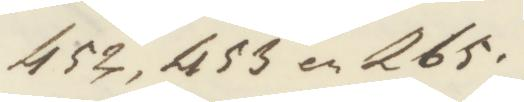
452, 453 en 265.
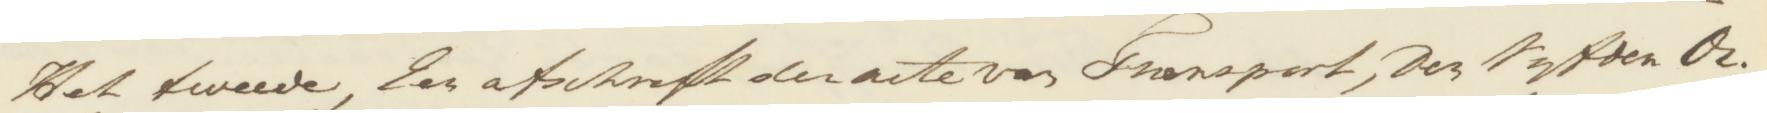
Het tweede, Een afschrift der acte van Transport, den Vyfden Oc.
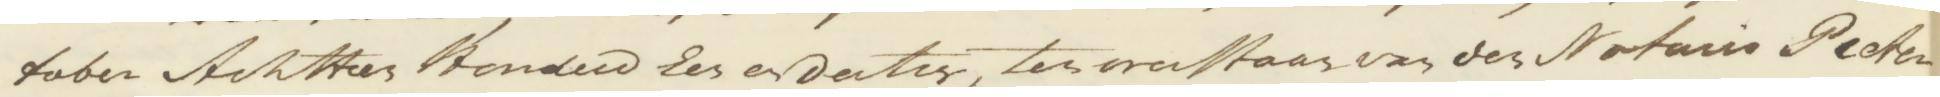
tober Achttien Honderd Een en dertig, ten overstaan van den Notaris Pieter
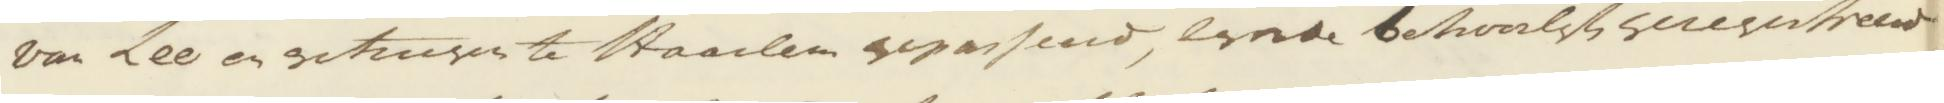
van Lee en getuigen te Haarlem gepasseerd, zynde behoorlyk geregistreerd
